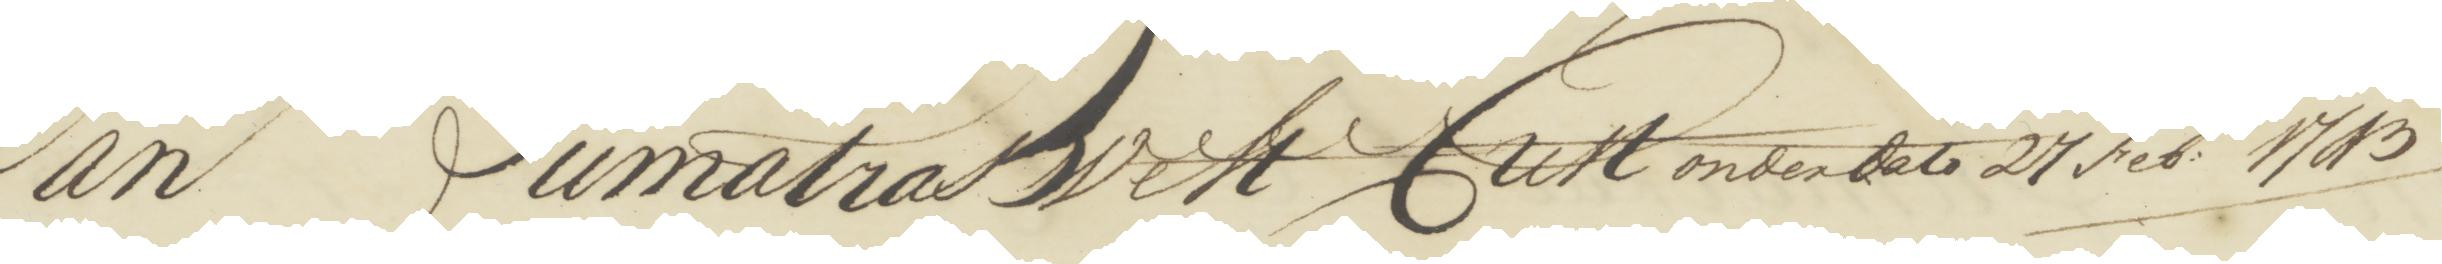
an Sumatras West Cust onder dato 27 Feb:ri 1743
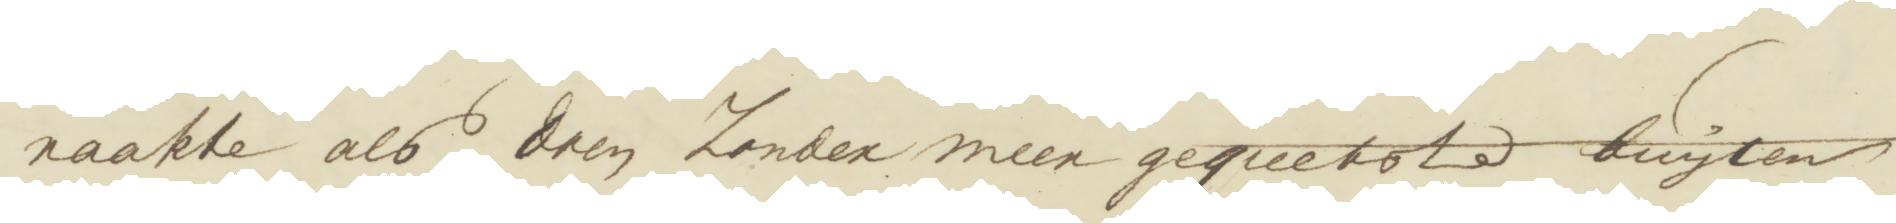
raakte als doen zonder meer gequetste buijten
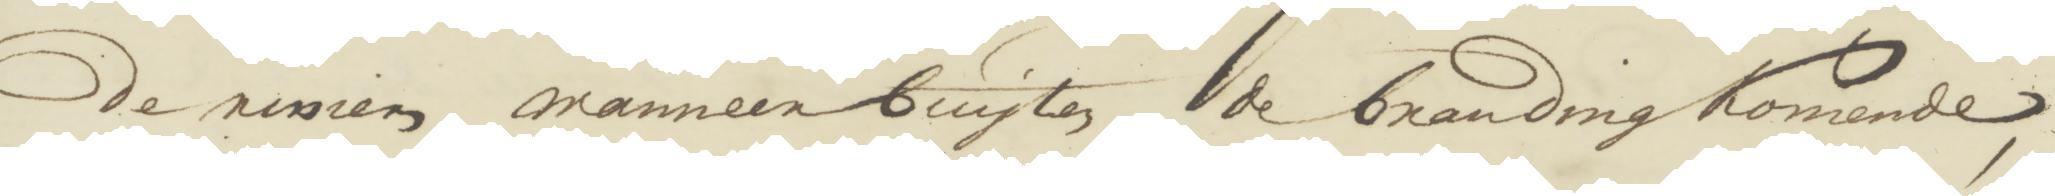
de rivier, wanneer buijten de branding komende,
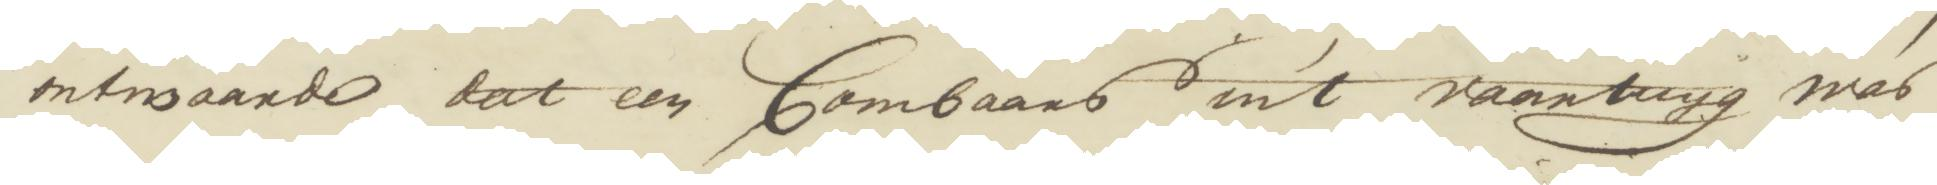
ontwaarde dat een Combaars in’t vaartuyg was
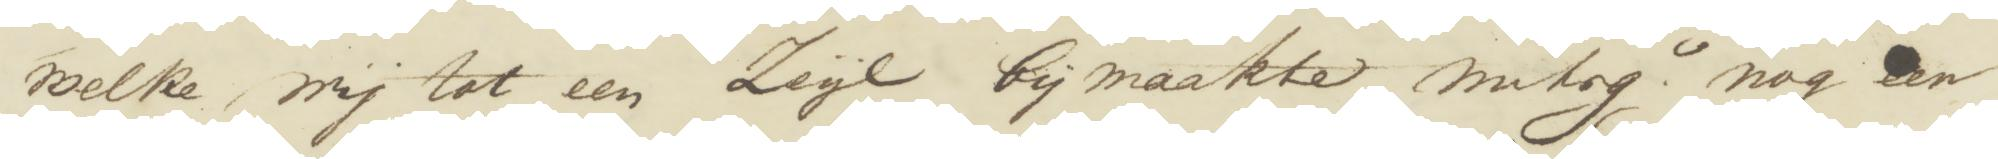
welke, wij tot een zeijl bij maakte mitsg.s nog een
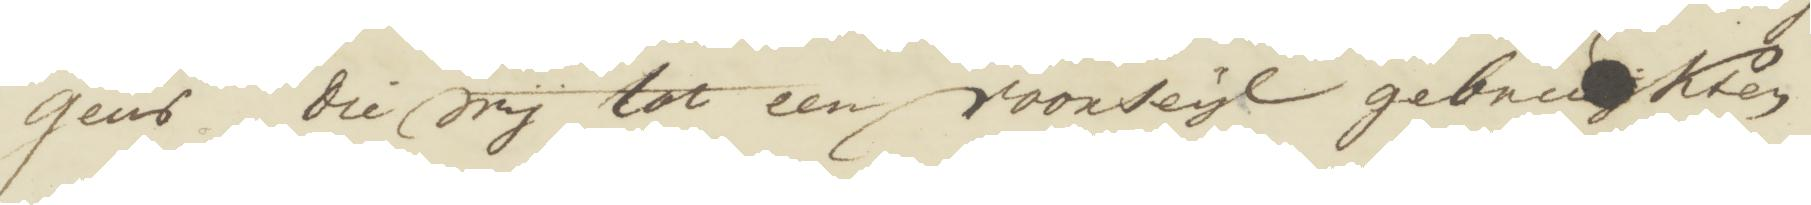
geus, die wij tot een voorseijl gebruijkten
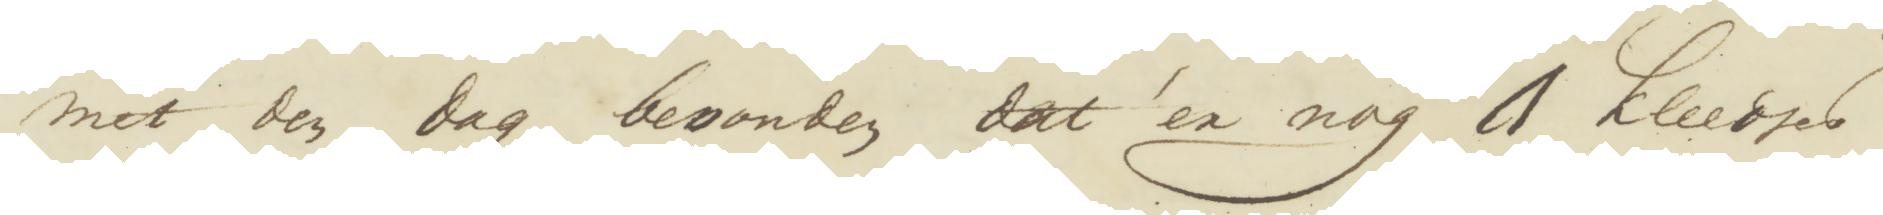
met den dag bevonden dat 'er nog 4 kleedjes
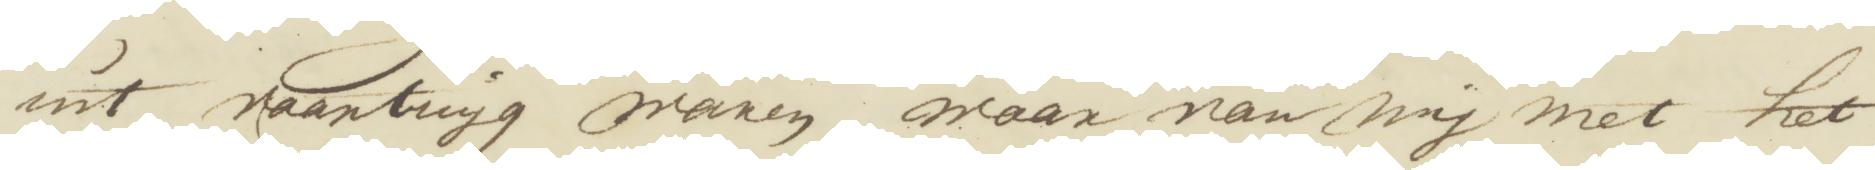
in't vaartuijg waren, waar van wij met het
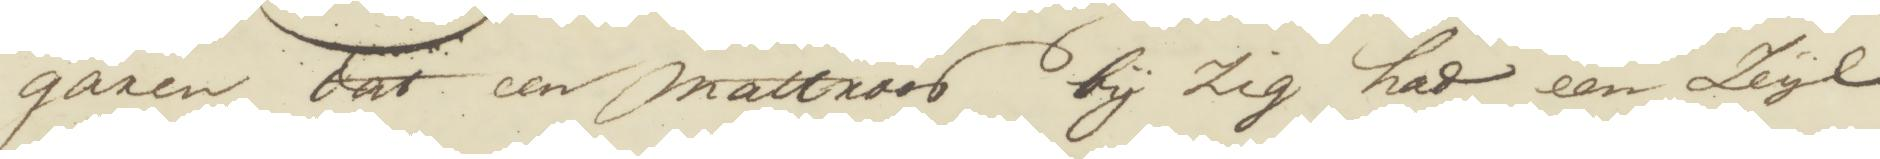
garen dat een mattroos bij zig had een zeijl
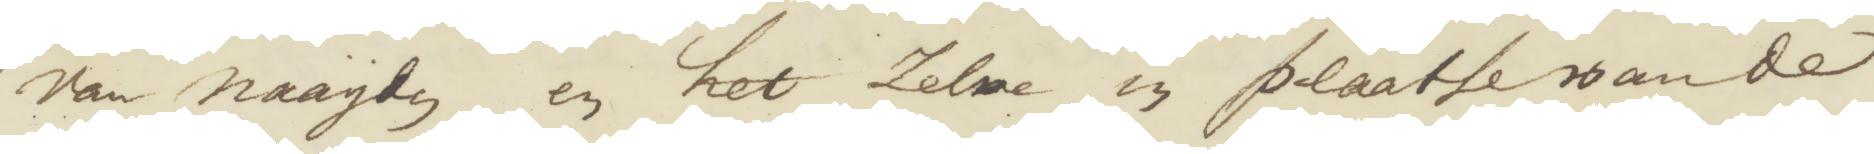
van naaijden en het zelve in plaatse van de
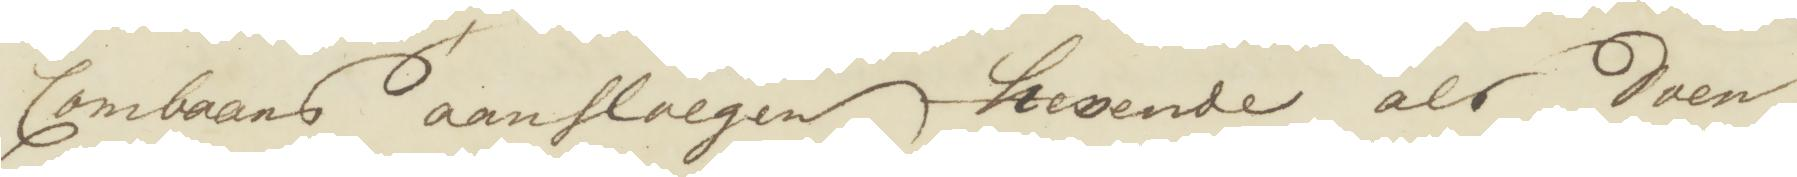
Combaars aansloegen, stevende als doen
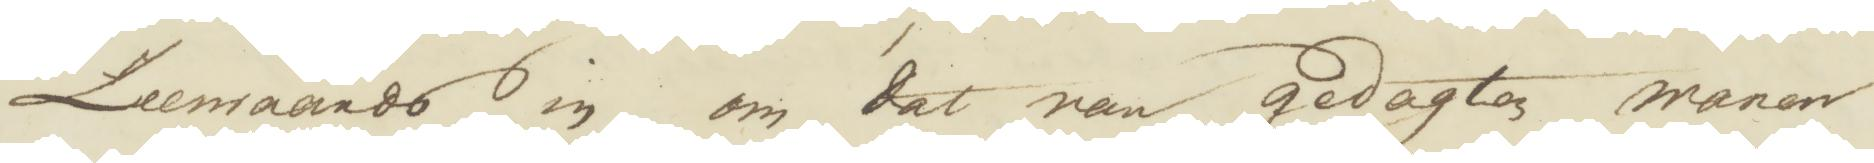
zeewaards in, om dat van gedagten waren
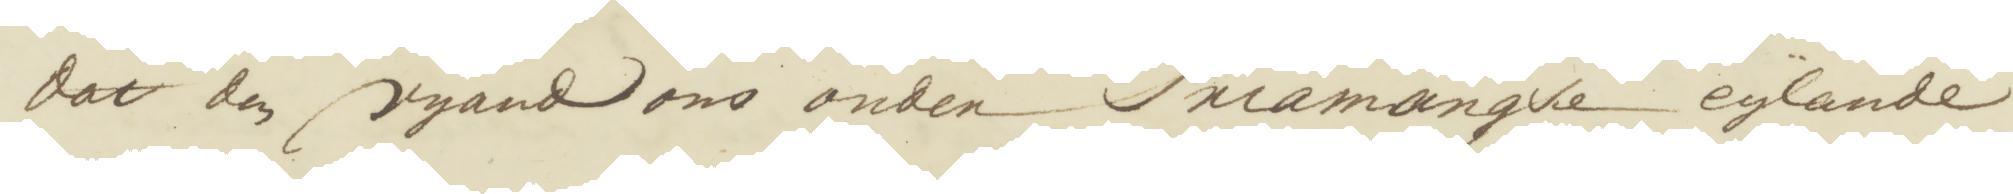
dat den vijand ons onder Priamangse eijlande
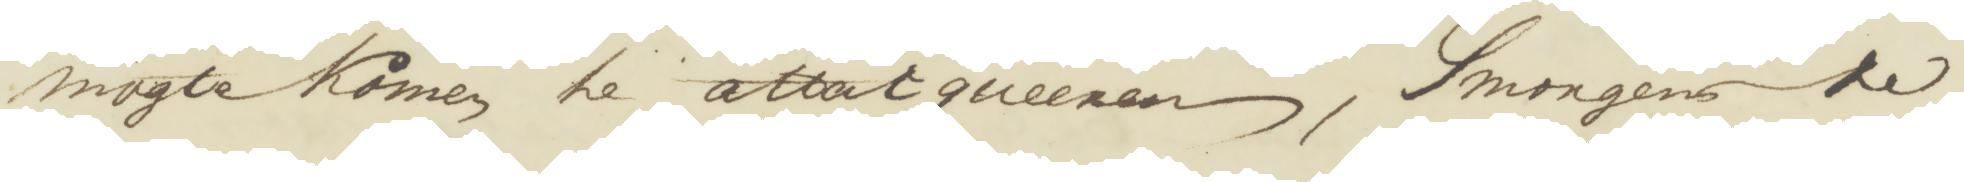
mogte komen te attacqueeren, smorgens te
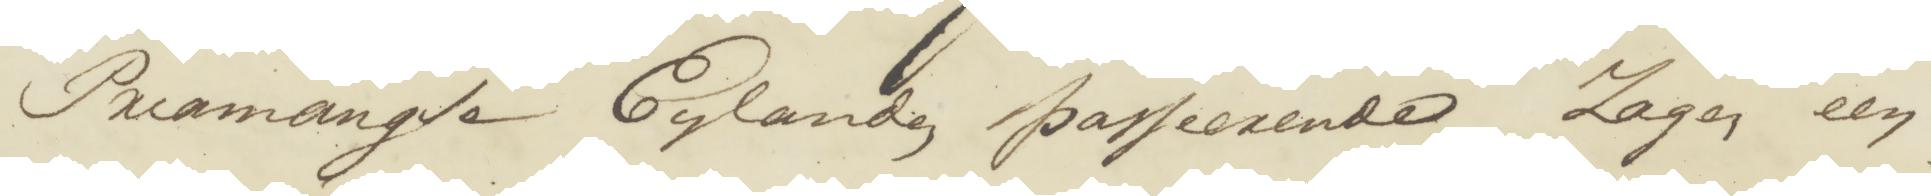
Priamangse Eijlanden passeerende zagen een
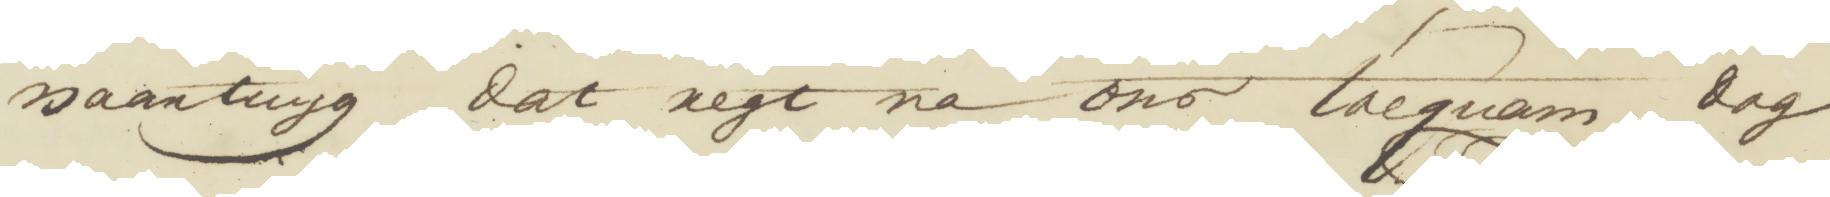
vaartuijg dat regt na ons toequam dog
